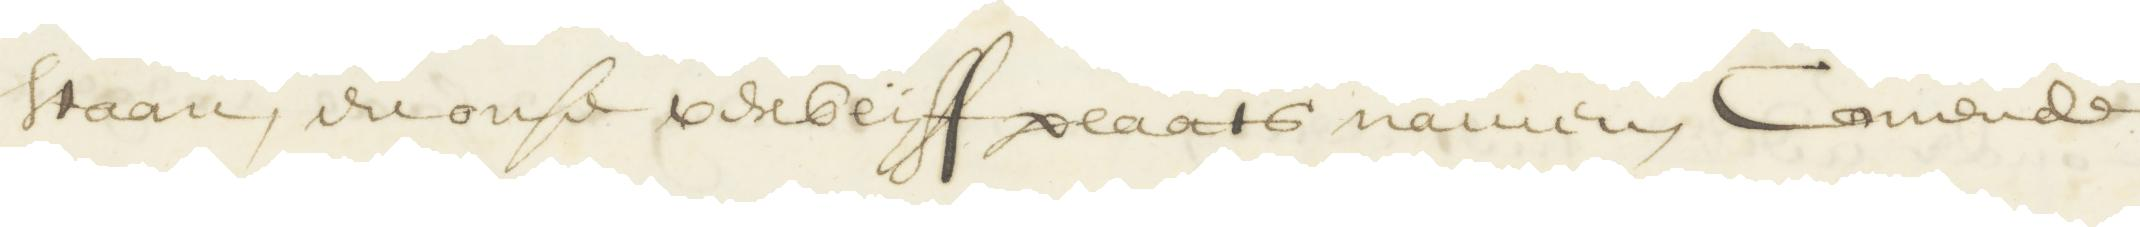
staan, en onse verbliiff plaats namen, Comende
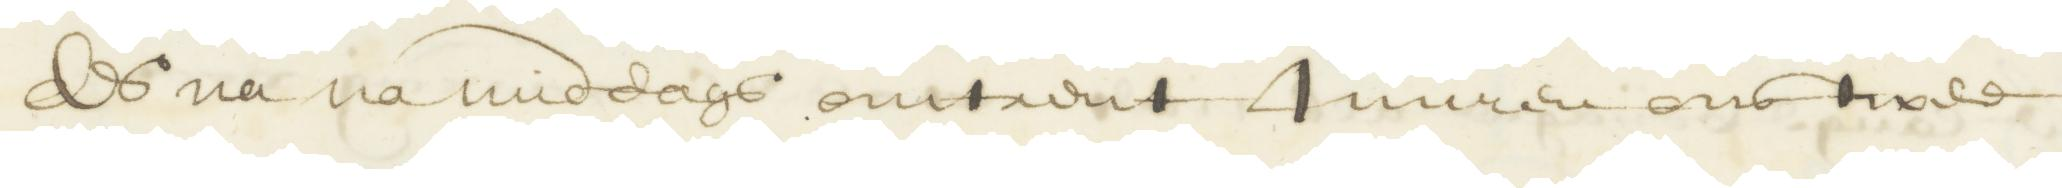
des na na middags omtrent 4 uuren ons twee
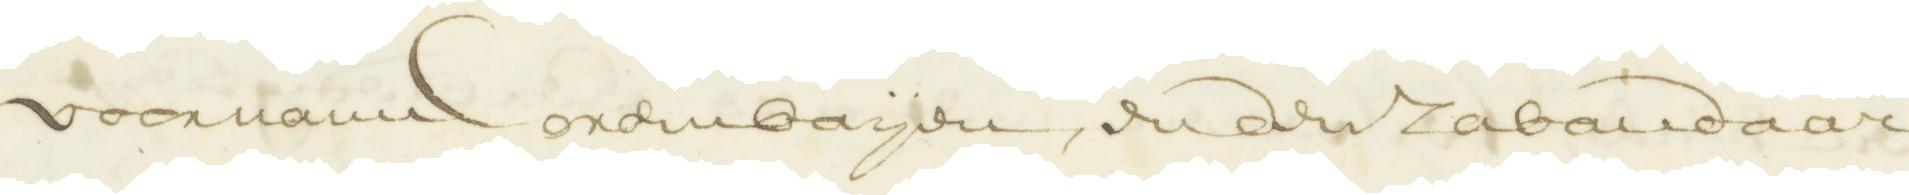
voorname orembaijen, en den zabandaar
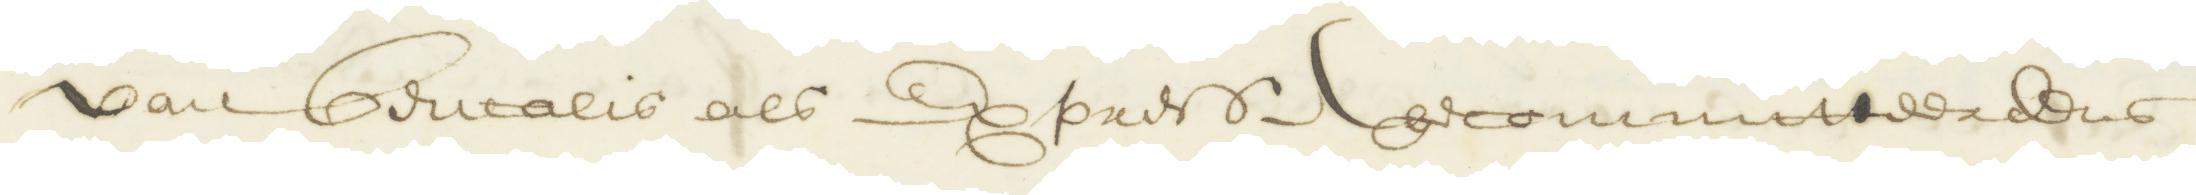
van bencalis als Expresse gecommitteerdens
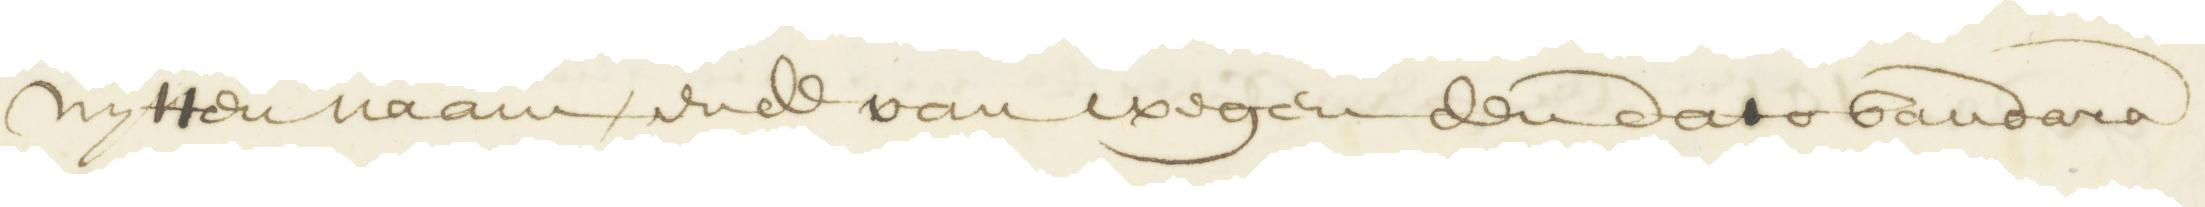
uijtter naam, ende van wegen den dato bandara
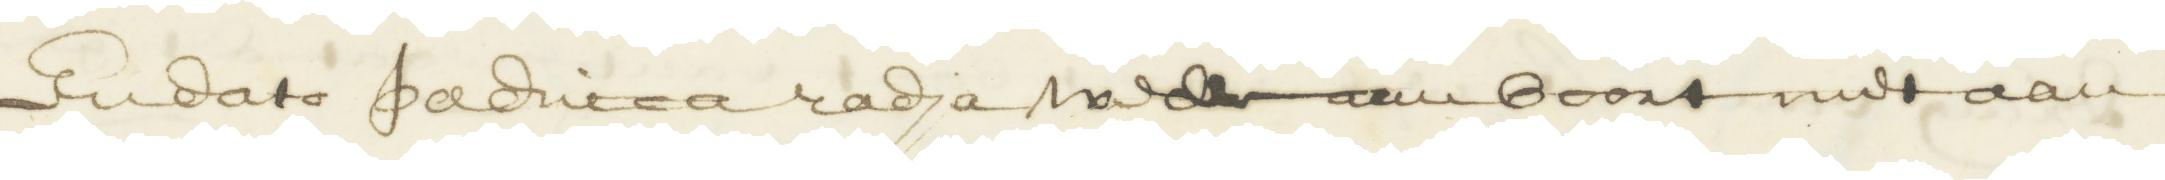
En dato paducca radja weder aan boort niet aan
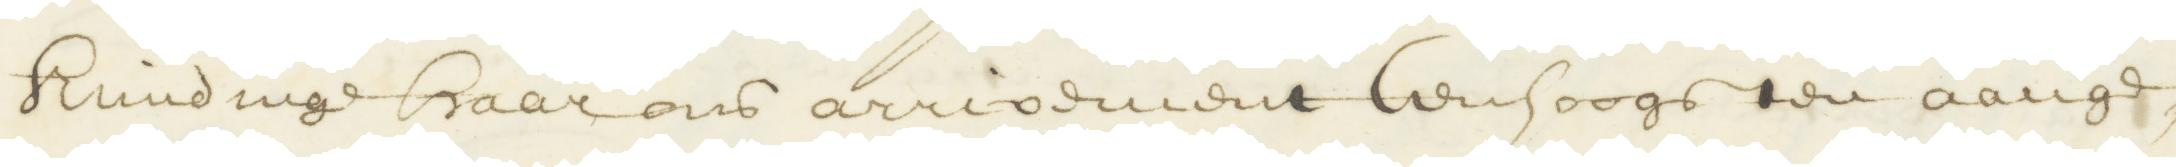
kundinge haar ons arrivement tenhoogsten aange„
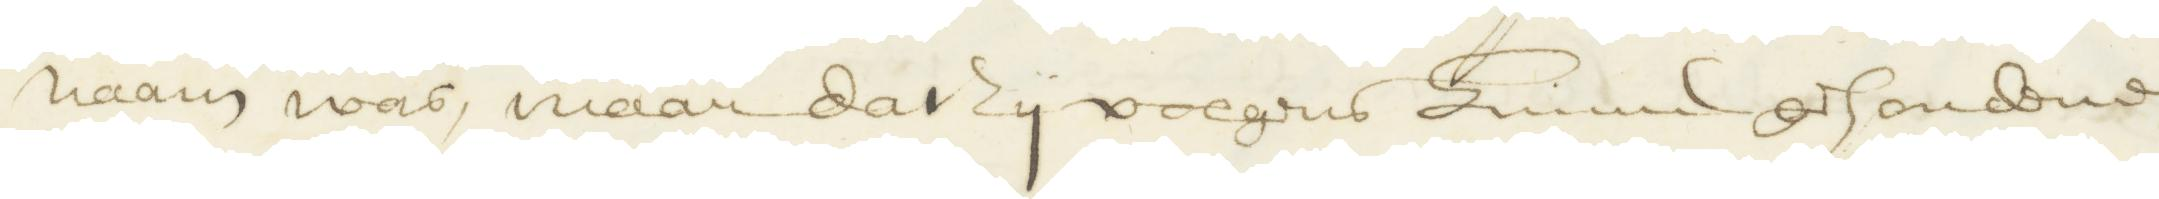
naam was, maar dat zij volgens hunne gesondene
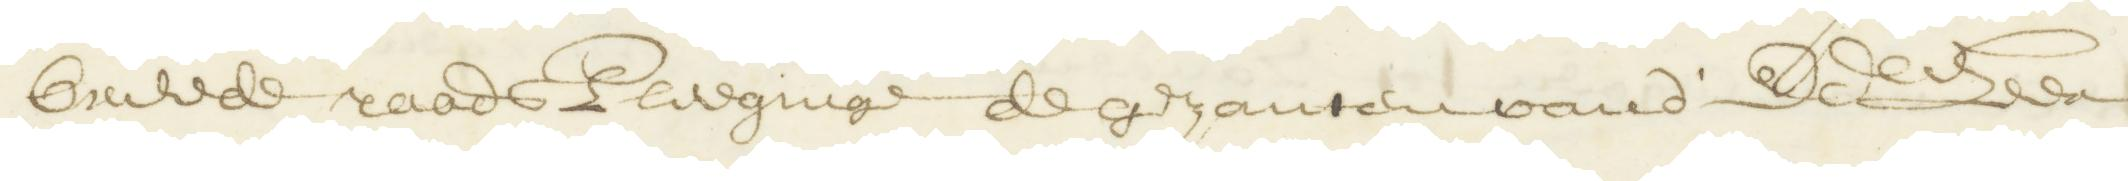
breede raads Pleeginge de gezanten van d’ Ed=le heer
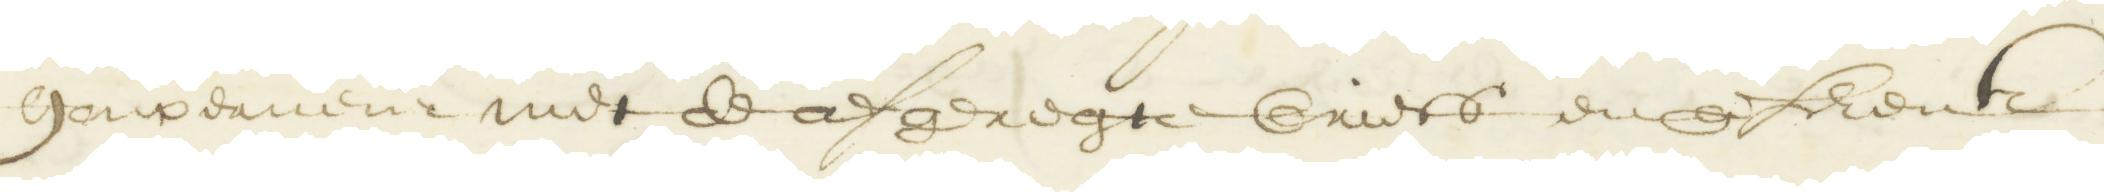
gouverneur met de afgeregte brieff en geschenk
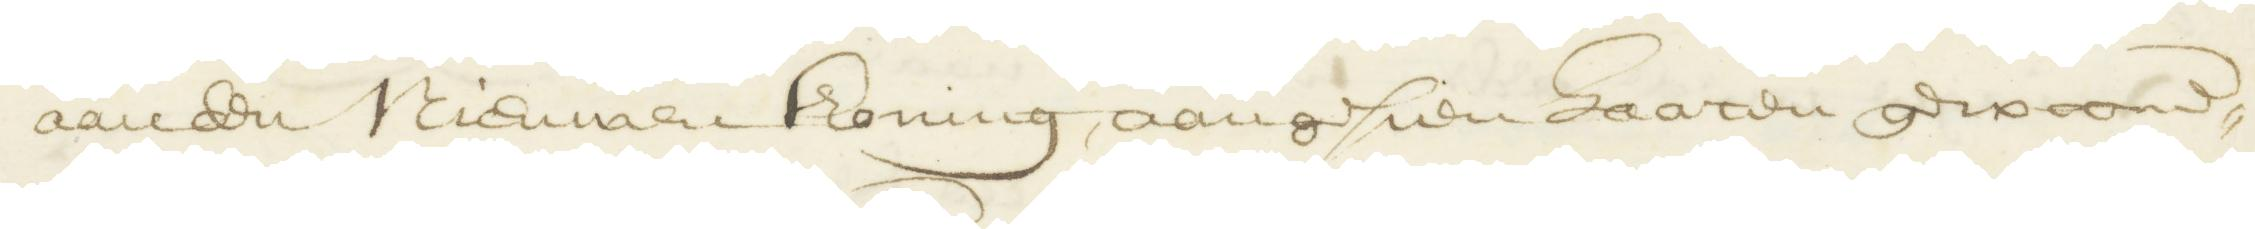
aan den Nieuwen koning, aangesien haaren gewoone„
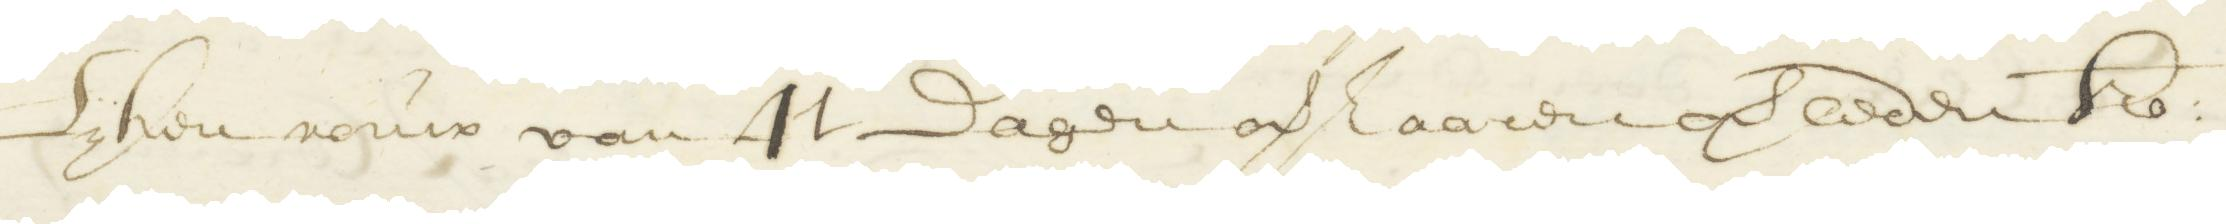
lijken rouw van 41 Dagen over haaren overleden ko:
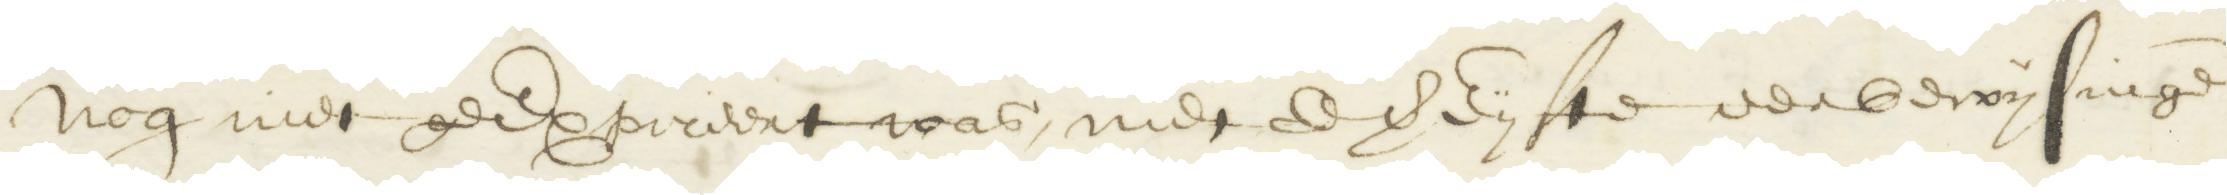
nog niet geExpireert was, met de vereijste eerbewijsinge
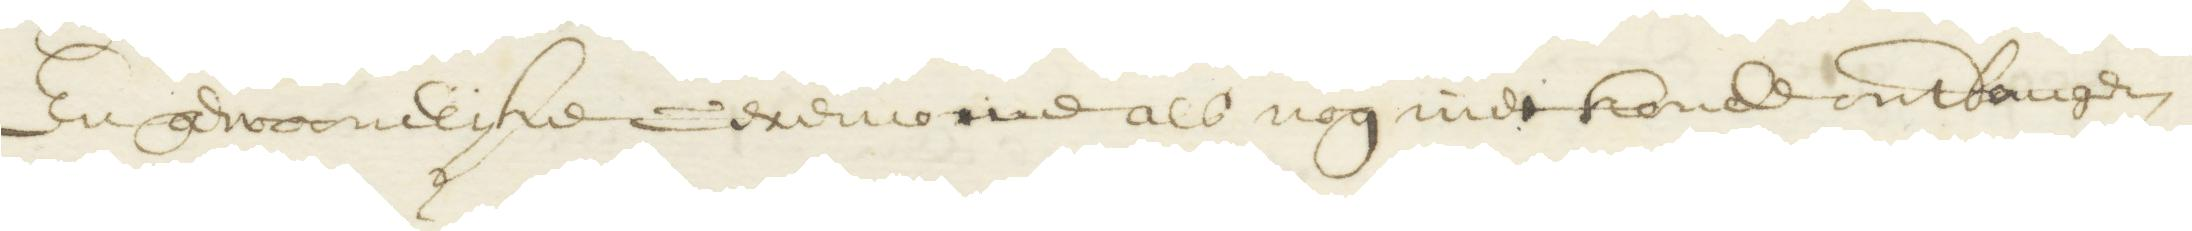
En gewoonelijke ceremonie als nog niet konde ontfangen,
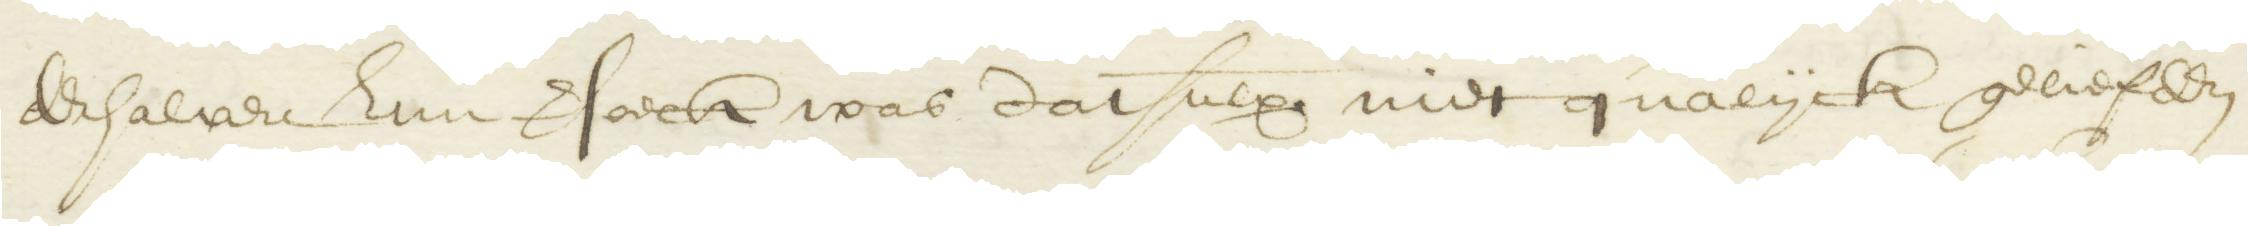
derhalven hun versoeck was dat sulx niet qualijck geliefden
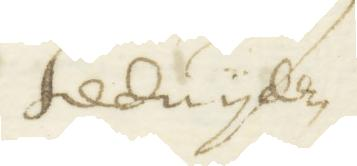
teduijden
